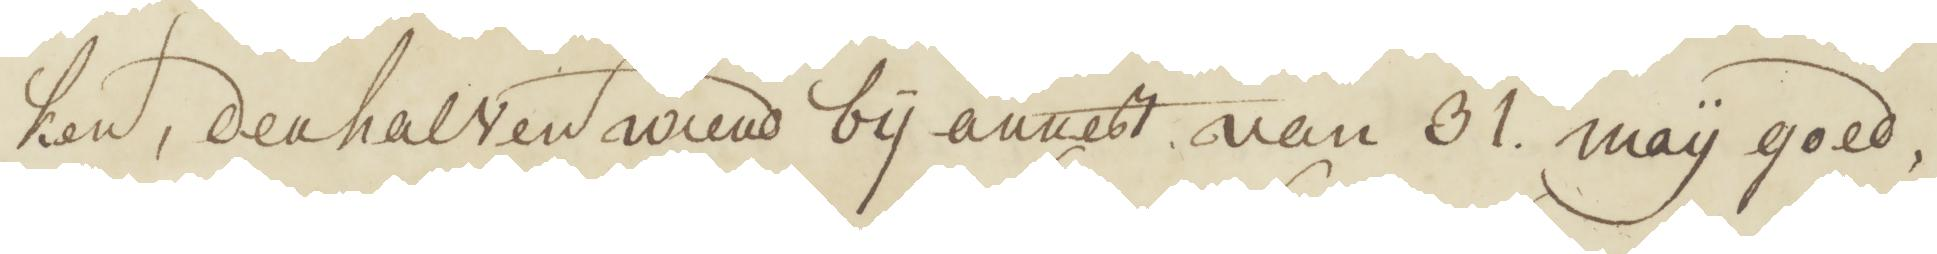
ker, derhalven wierd bij arrest van 31. maij goed,
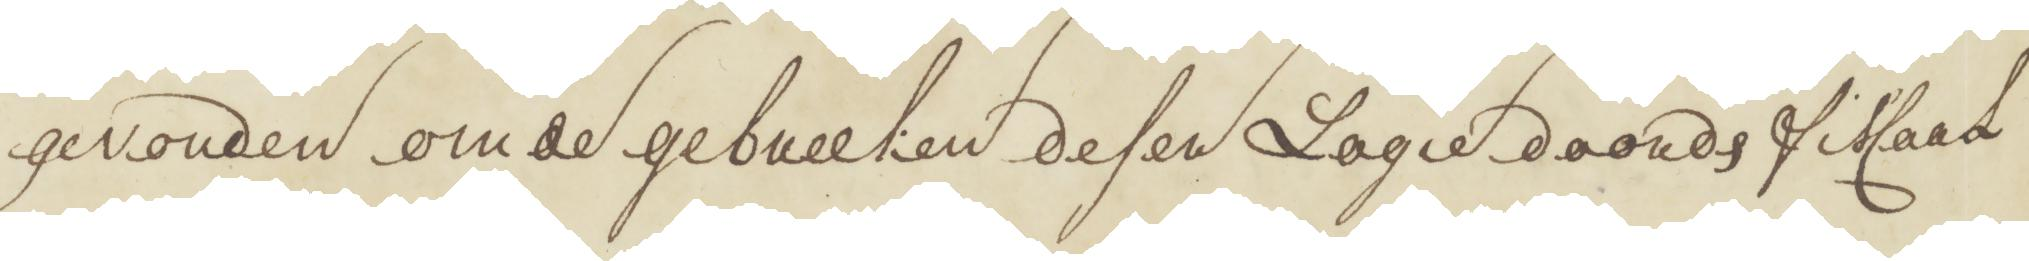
gevonden om de gebreeken deser Logie door den fiscaal
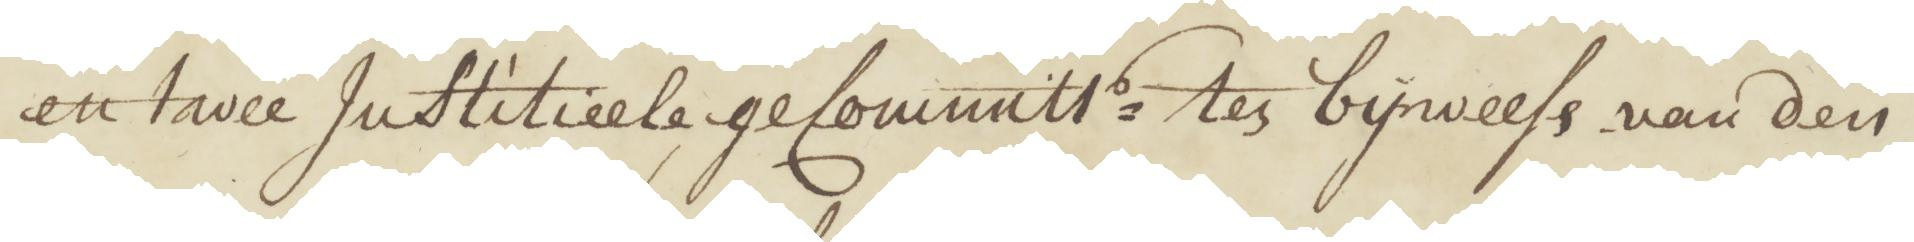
en twee Justitieele gecommitt=s ten bijweesen van den
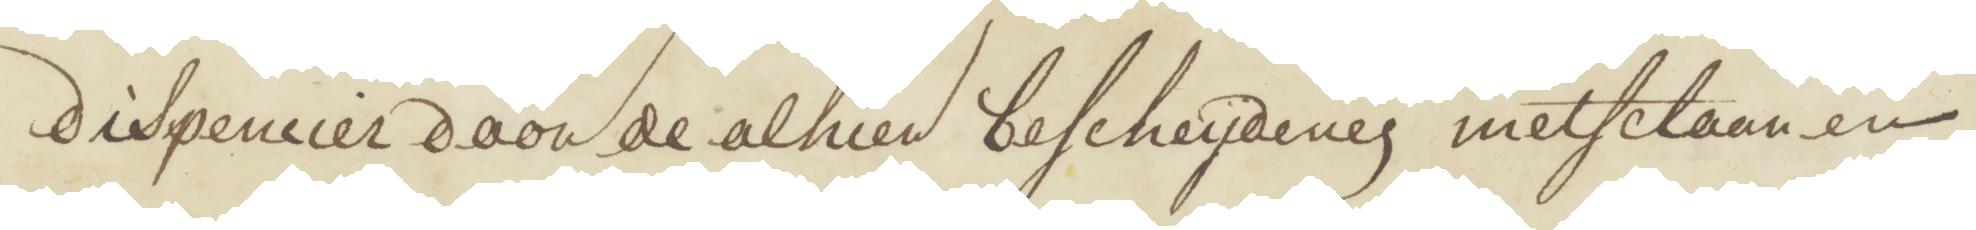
dispencier door de alhier bescheijdenen metselaar en
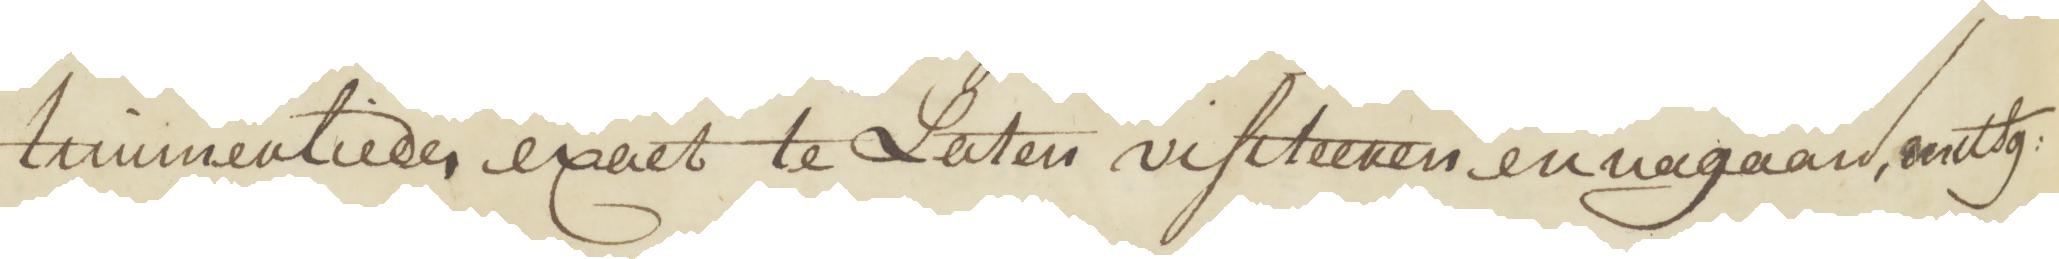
timmerlieden exact te Laten visiteeren en nagaan, mitsg:
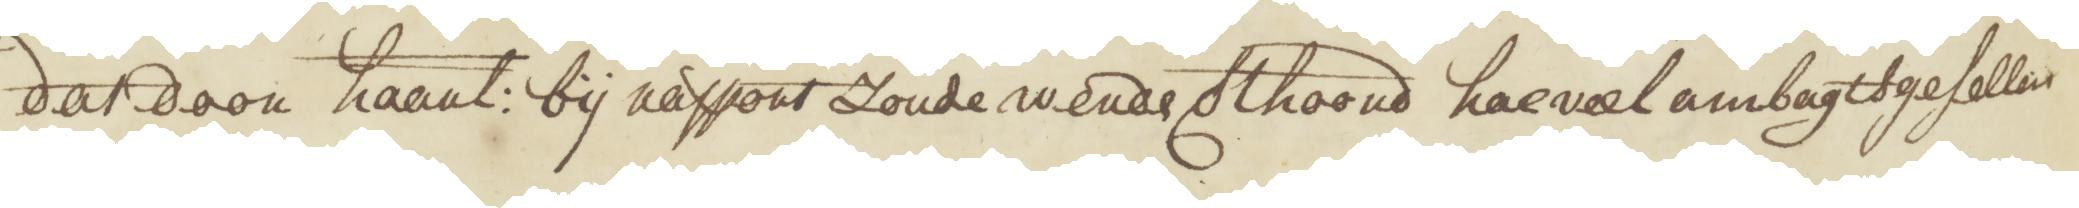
dat door haarl: bij rapport zoude werden verthoond hoeveel ambagtsgesellen
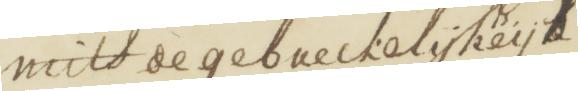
mits de gebreckelijkeijt
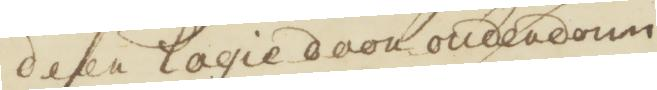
deser logie door ouderdom
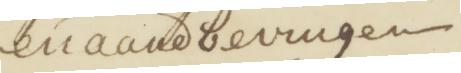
en aardbevingen
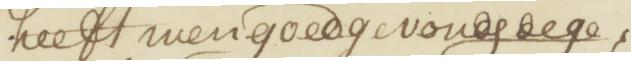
heeft men goedgevonden dege,
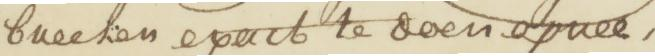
breeken exact te doen opnee,
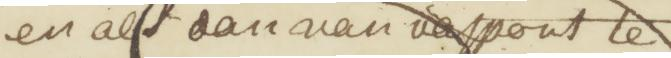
en als dan van rapport te
